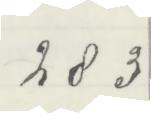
283
